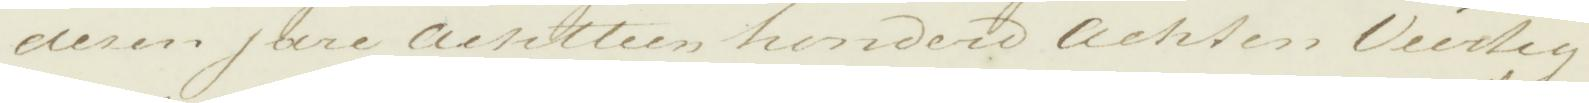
dezer jare Achttien honderd acht en Veertig
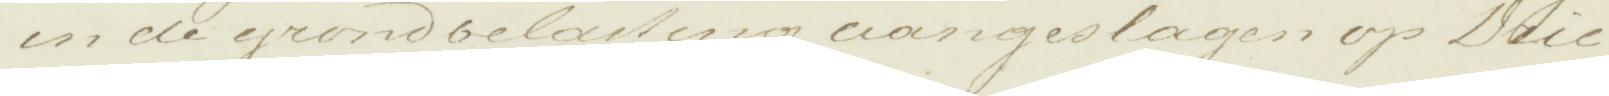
in de grondbelasting aangeslagen op Drie
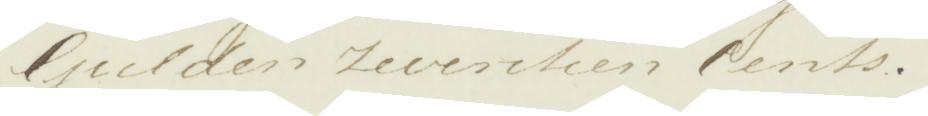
Gulden zeventien Cents.
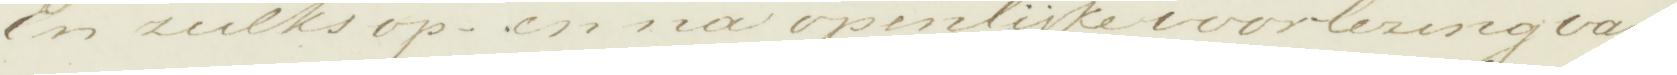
En zulks op - en na openlijke voorlezing van
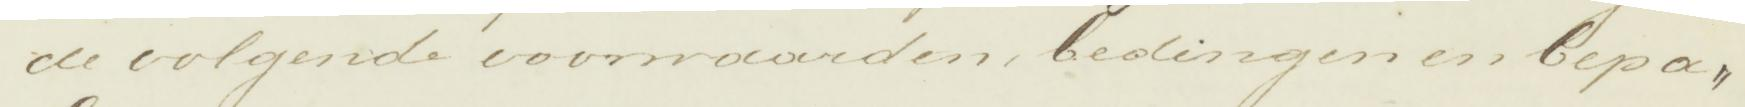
de volgende voorwaarden, bedingen en bepa„
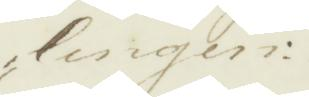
„lingen:
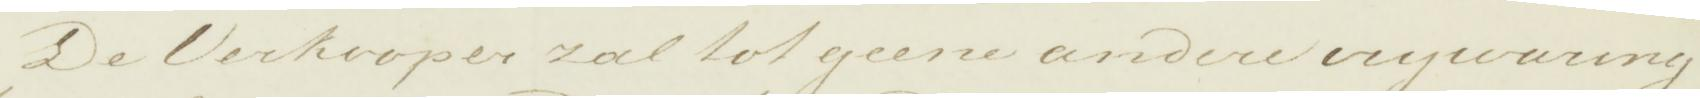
De Verkooper zal tot geene andere vrywaring
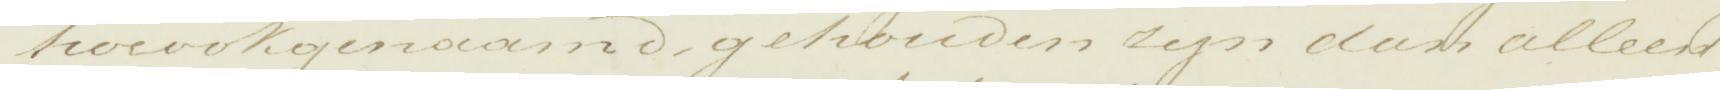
hoe ook genaamd, gehouden zyn dan alleen
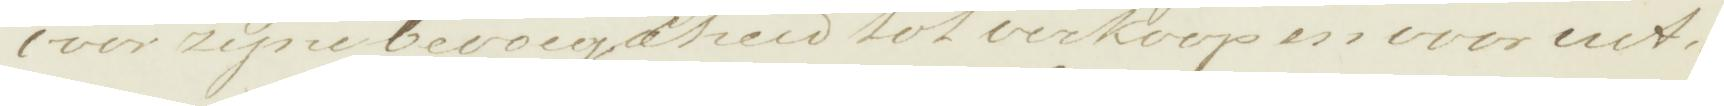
voor zyne bevoegdheid tot verkoop en voor uit„
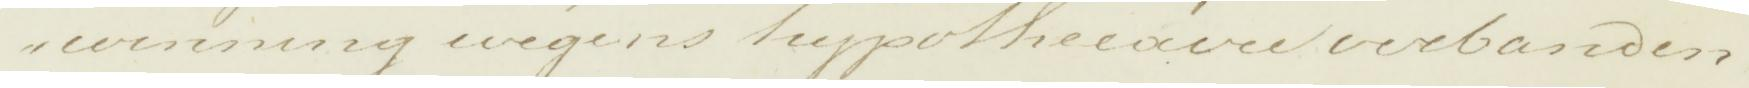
„winning wegens hypothecaire verbanden
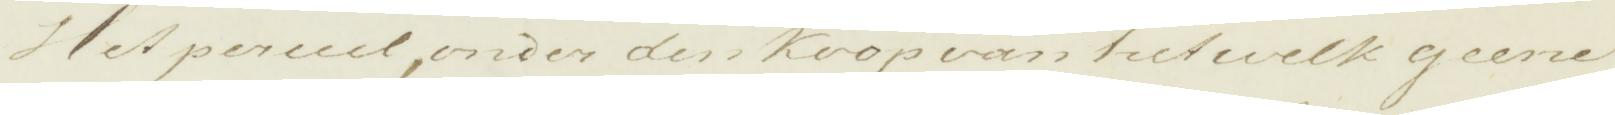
Het perceel, onder den koop van het welk geene
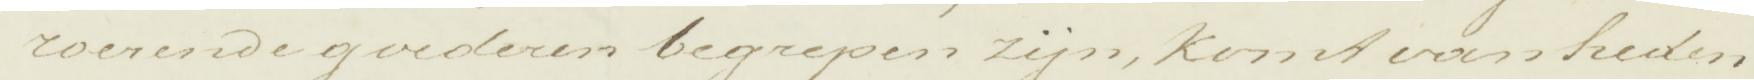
roerende goederen begrepen zijn, komt van heden
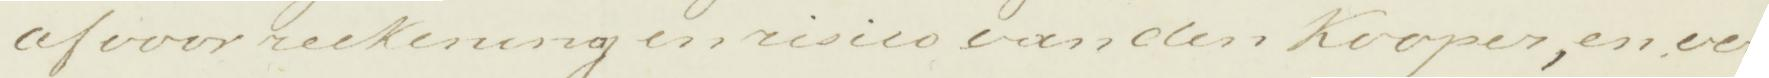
af voor reekening en risico van den Kooper, en ver
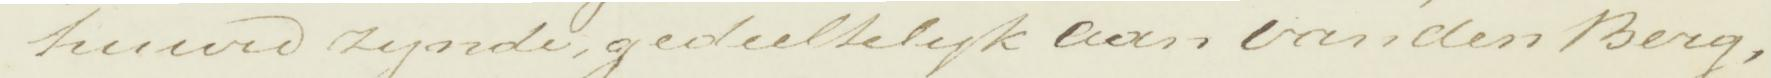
huurd zynde, gedeeltelyk aan van den Berg,
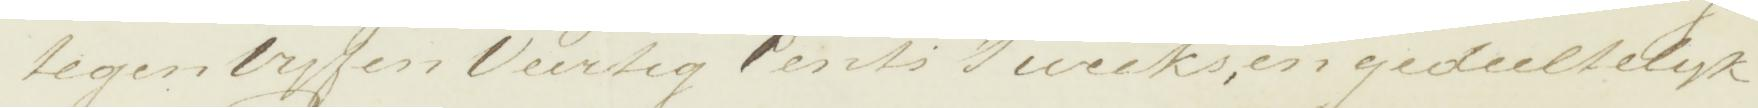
tegen vyf en Veertig Cents 's weeks, en gedeeltelyk
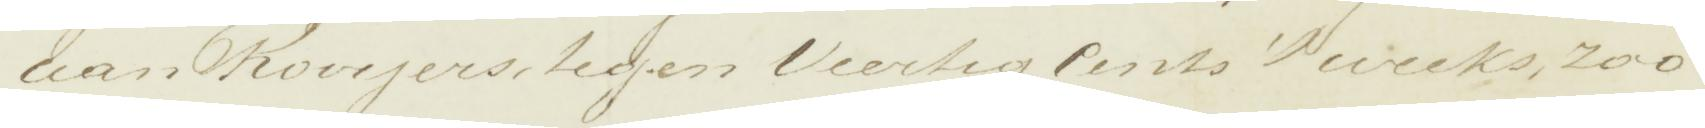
aan Rooyers, tegen Veertig Cents 's weeks, zoo
